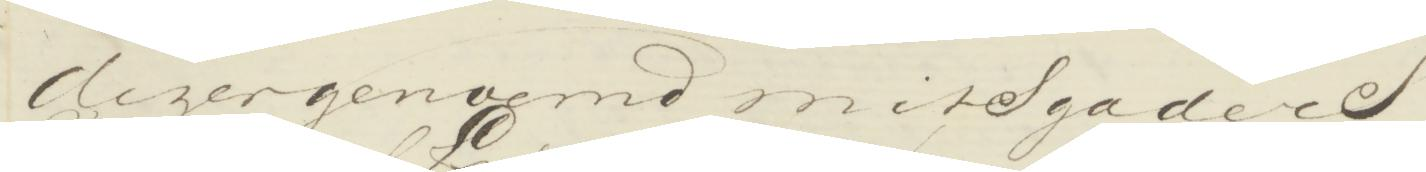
dezergenoemd mitsgaders
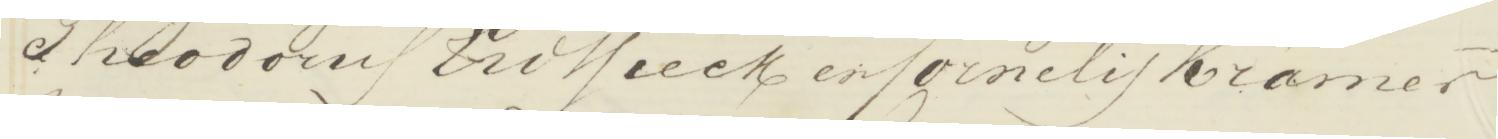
Theodorus Erdtsieck en Cornelis Kramer
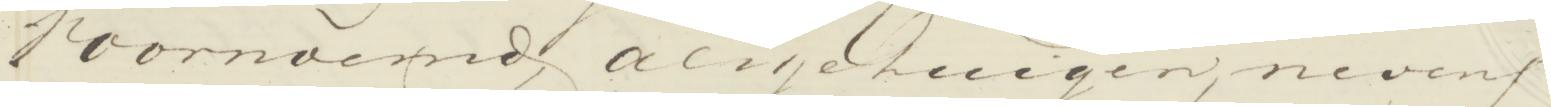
voornoemd, als getuigen, nevens
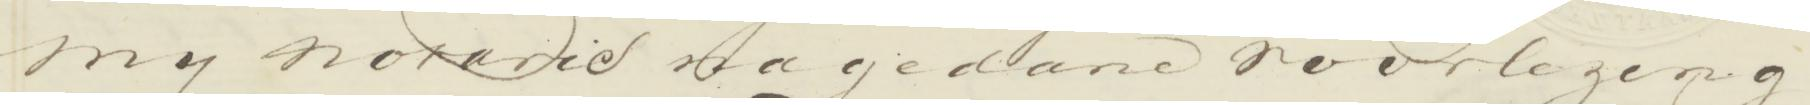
my notaris nagedane voorlezing
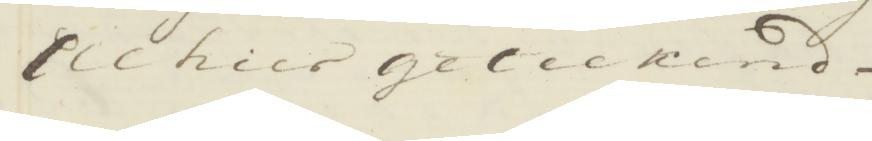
alhier geteekend
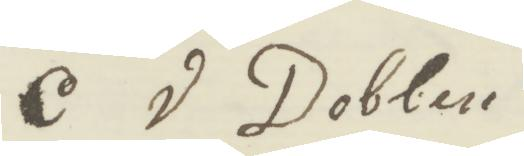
C V Dobben
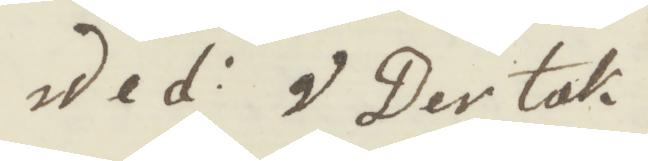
wed: V Der tak
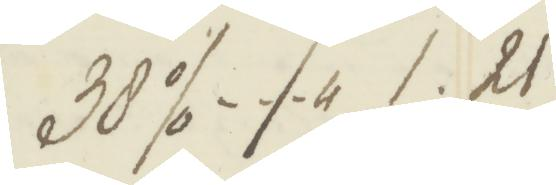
38 % - - - „ 1. 21½
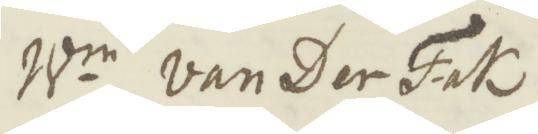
W-m van Der Tak
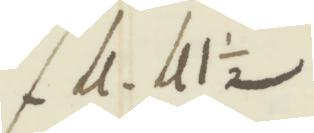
ƒ 4.41½
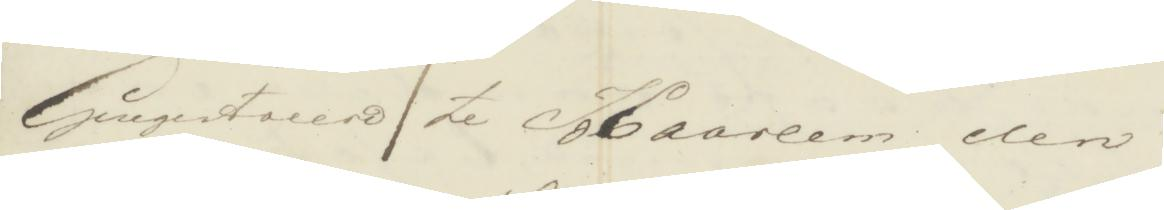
Gregistreerd te Haarlem den
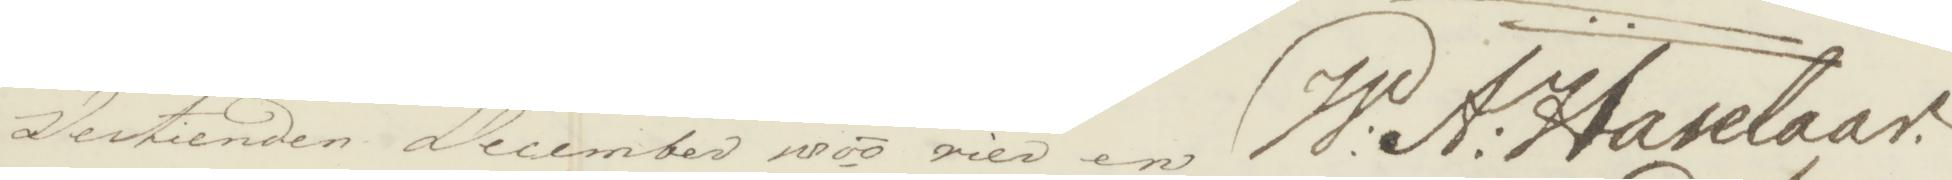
Dertienden December 1800 vier en W: A: Haselaar
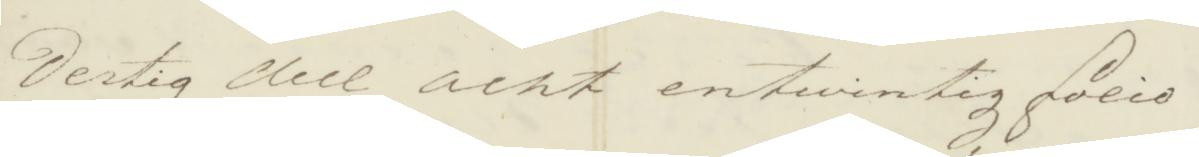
dertig deel acht entwintig folio
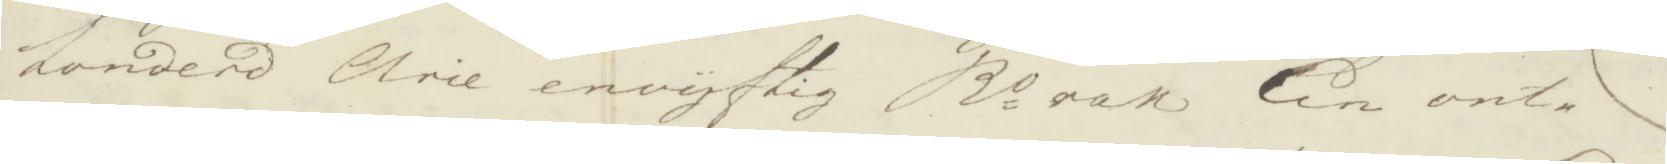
honderd drie envijftig R=o vak Een ont„
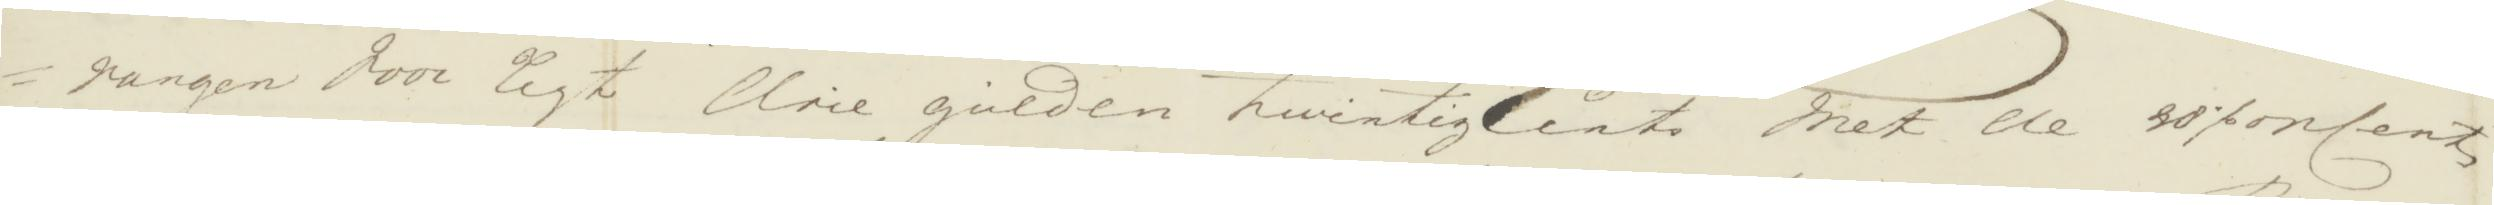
=vangen voor regt drie gulden twintig Cents met de 38% opCenten
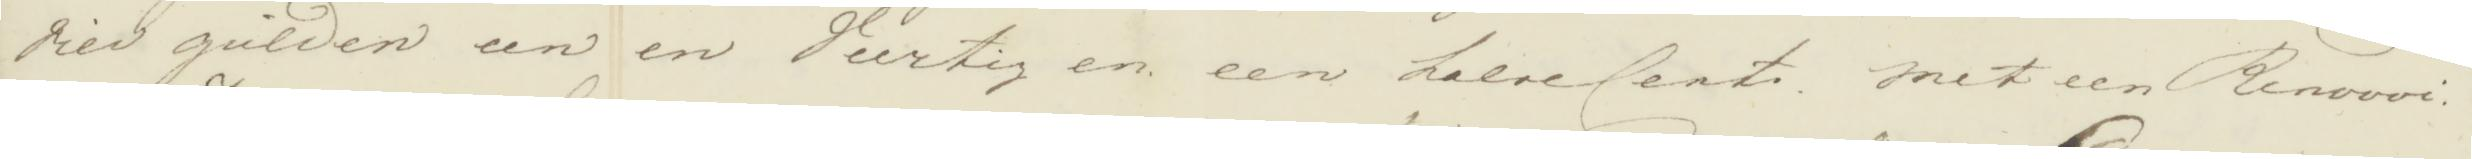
vier gulden een en Veertig en een halve Cent met een Renvooi.
